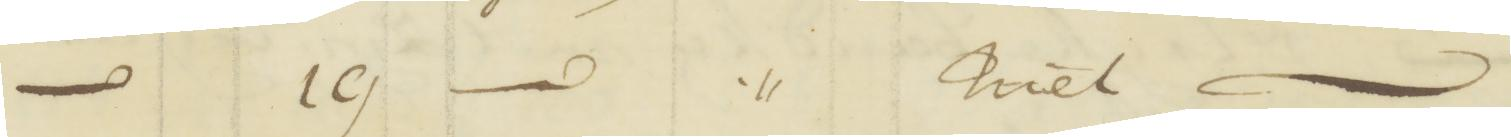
_o 19 _o .„ niet —
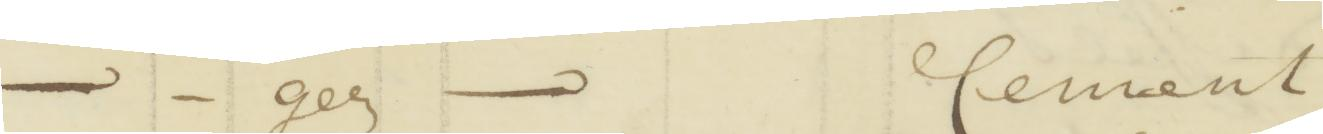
_o geen _o Cement
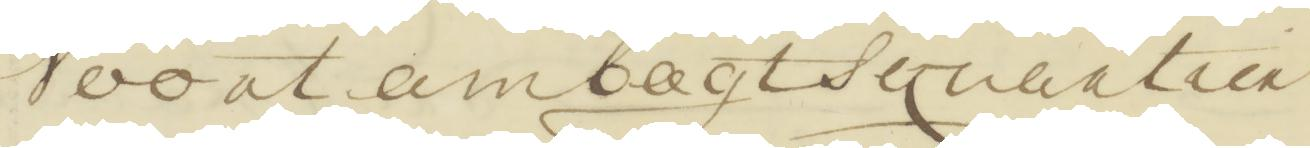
Voort ambagtsquartier
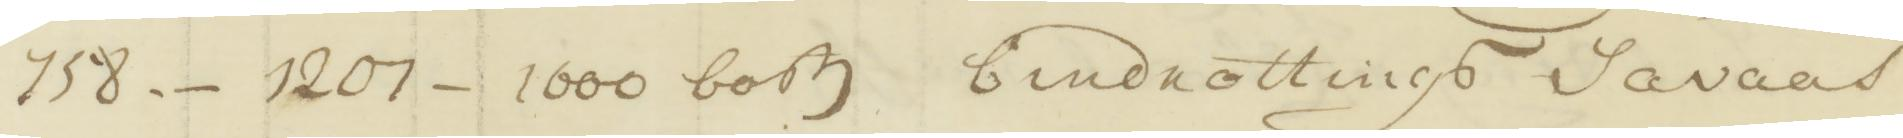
758.– 1207 – 1600 bosz bindrottings Iavaas
